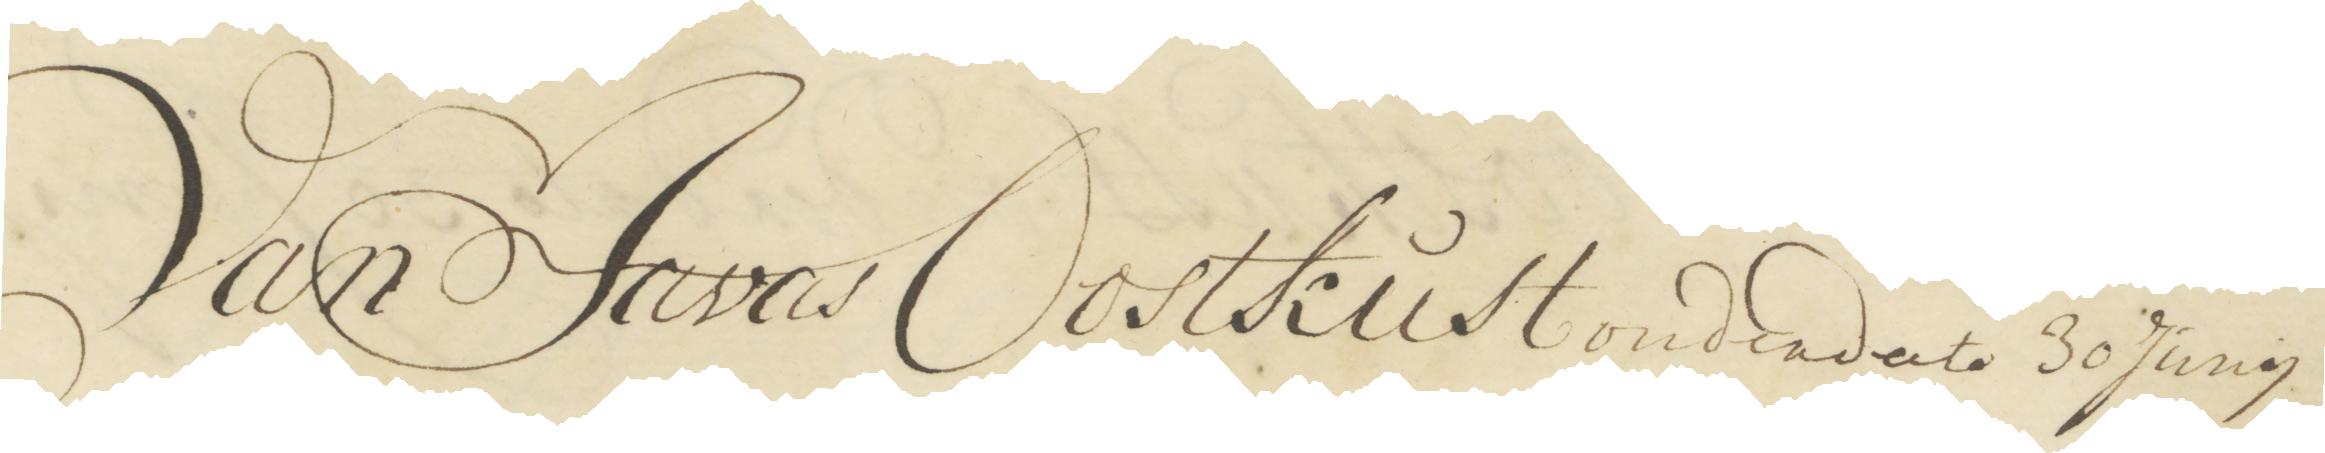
Van Javas Oostkust onder dato 30 Junij
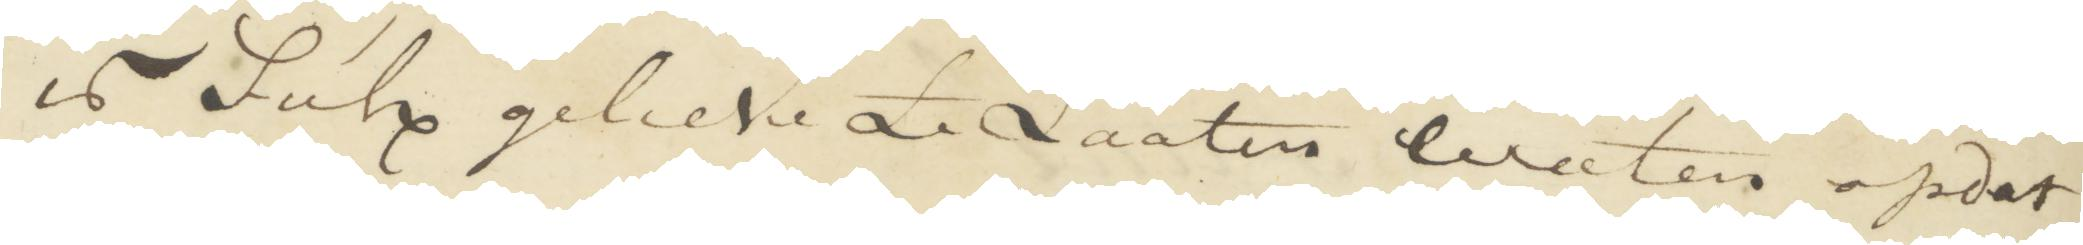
is sulx gelieve te laaten weeten opdat
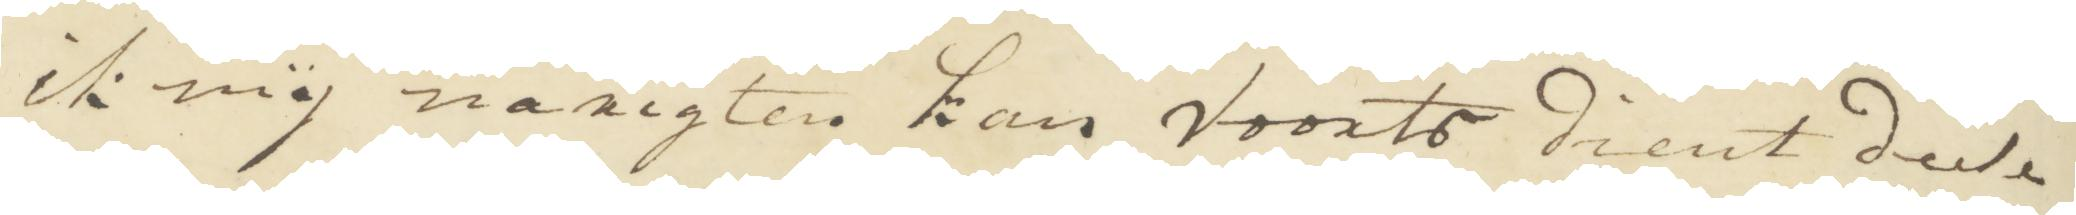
ik mij narigten kan voorts dient deese
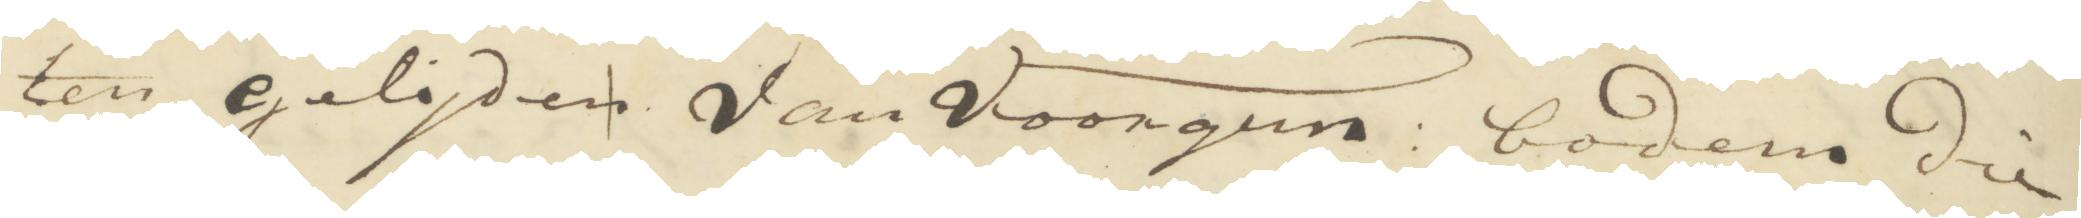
ten gelijden van voorgem: bodem die
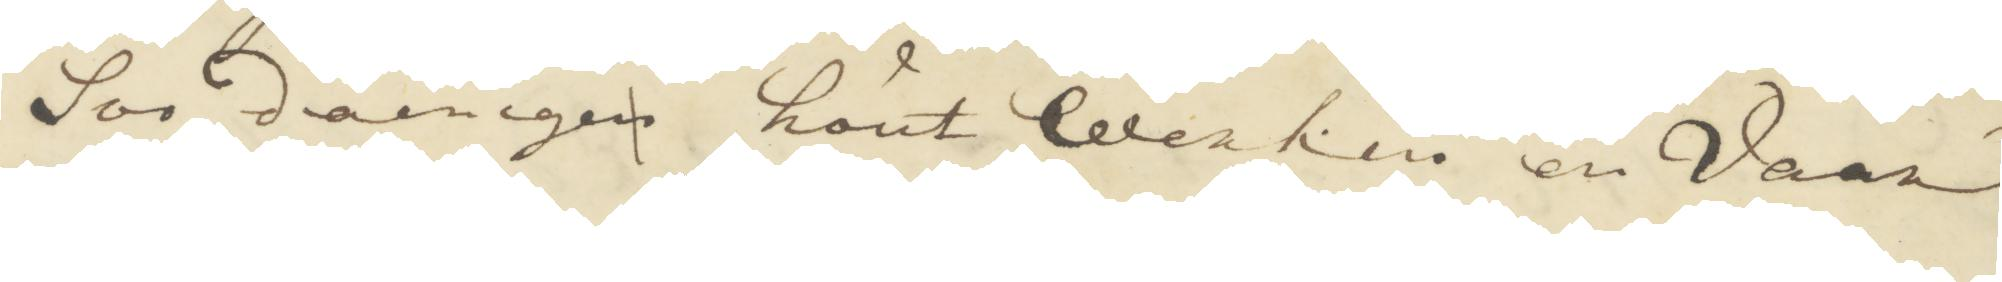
soo daenigen hout werken en vaar
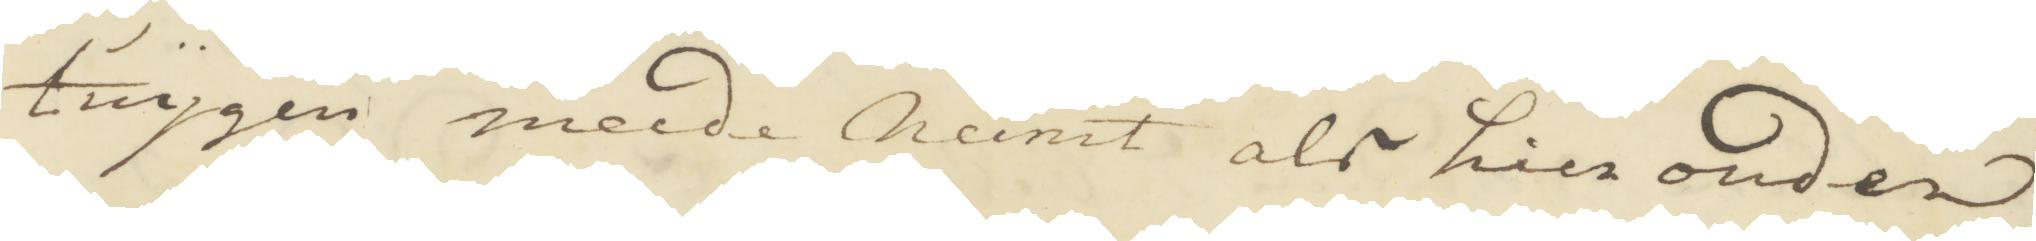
tuijgen meede neemt als hier onder
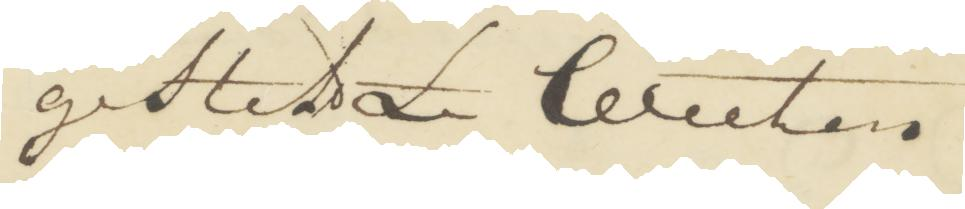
gesteld te weeten
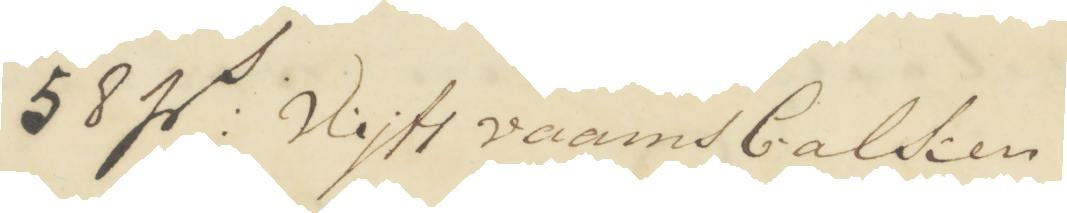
58 p:s vijft vaams balken
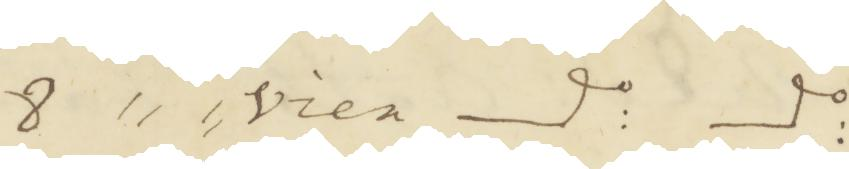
8 „ „ vier _:o _o
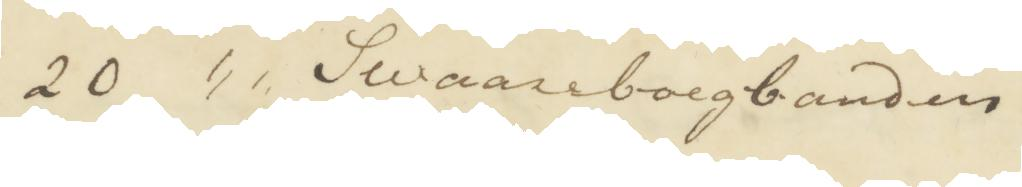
20 „ „ swaareboeg banden
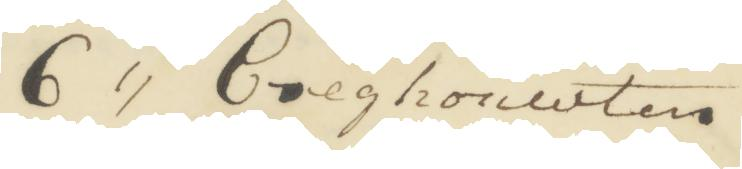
6 „ boeghouwten
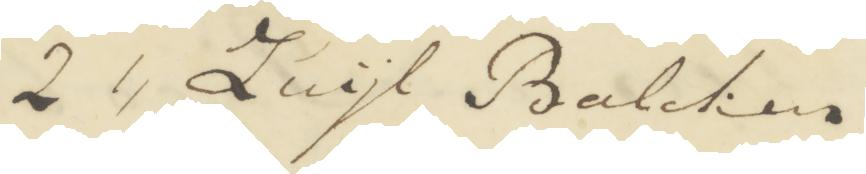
2 „ Zuijl Balcken
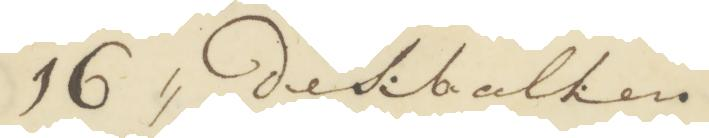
16 „ dekbalken
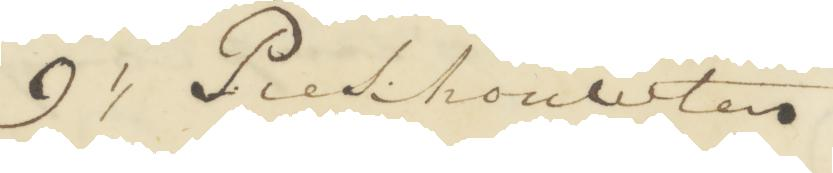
9 „ Piekhouwten
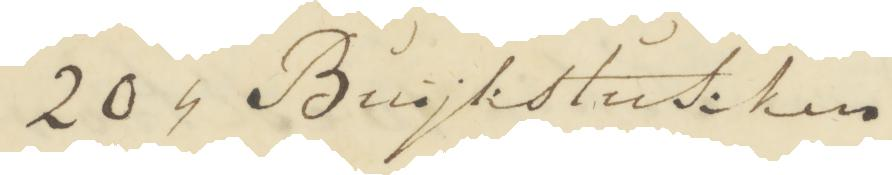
20 „ Buijkstukken
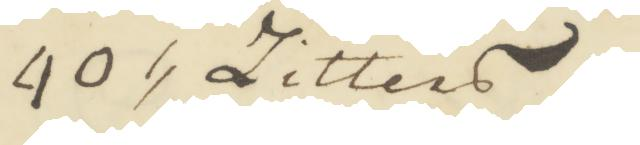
40 „ Zitters
